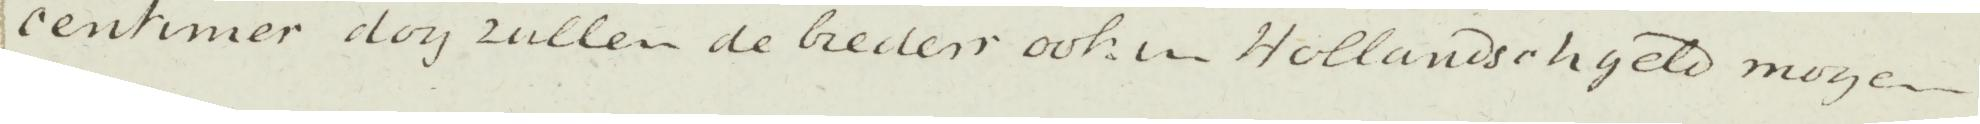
centimes dog zullen de bieders ook in Hollandsch geld mogen
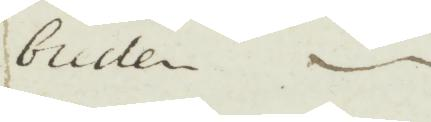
bieden
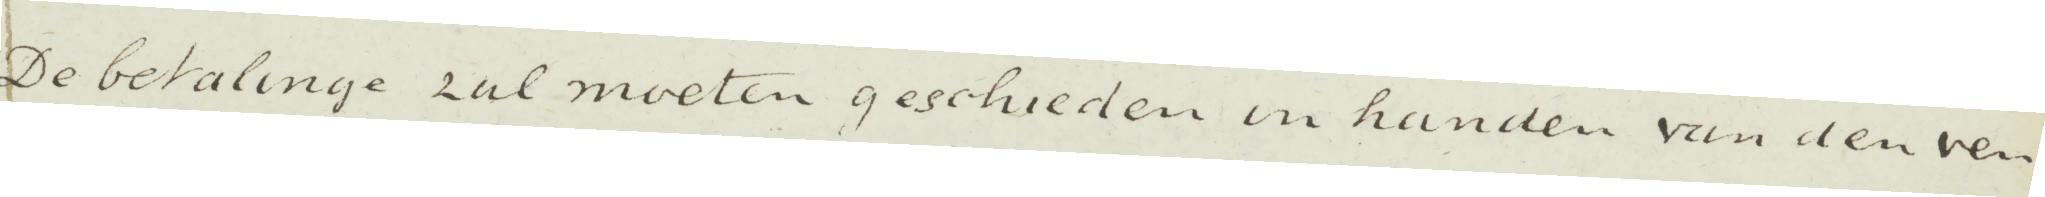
De betalinge zal moeten geschieden in handen van den ver
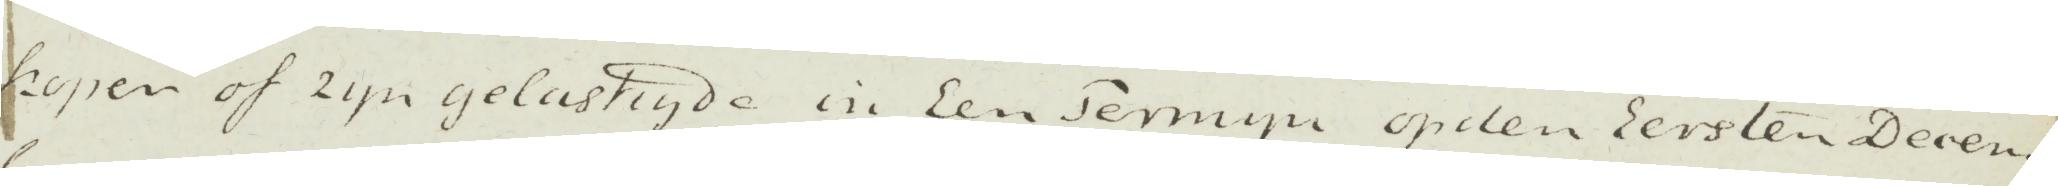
koper of zyn gelastigde in Een Termyn op den Eersten Decem
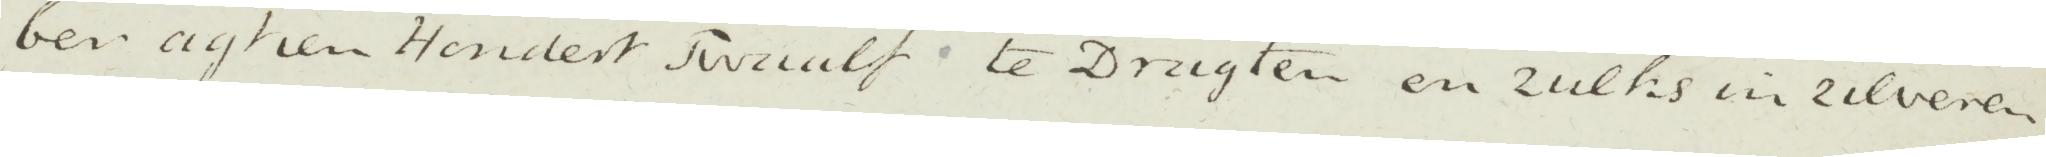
ber agtien Hondert Twaalf te Dragten en zulks in zilveren
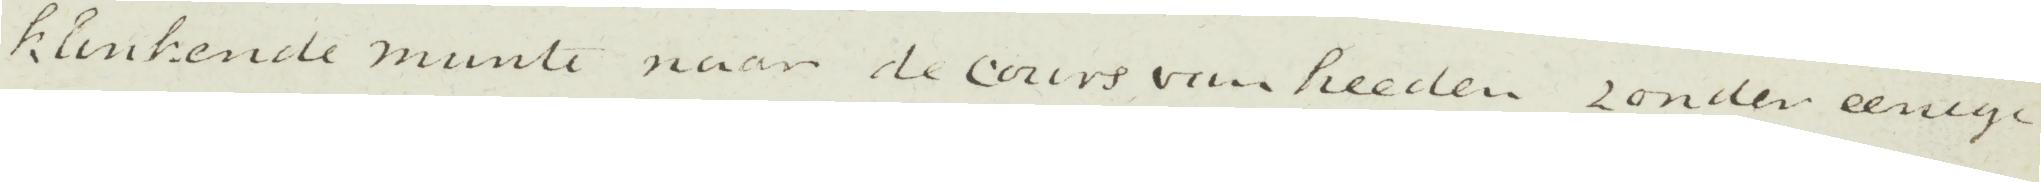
klinkende munte naar de cours van heeden zonder eenige
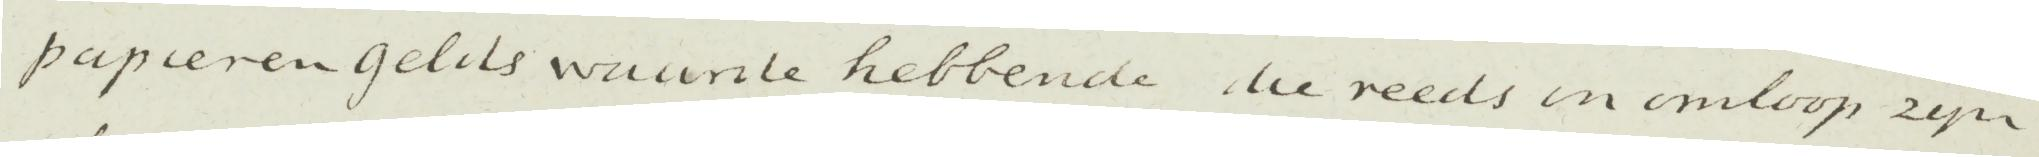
papieren gelds waarde hebbende die reeds in omloop zyn
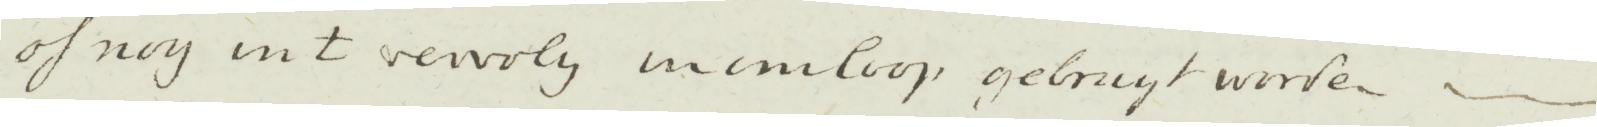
of nog int vervolg in omloop gebragt worden
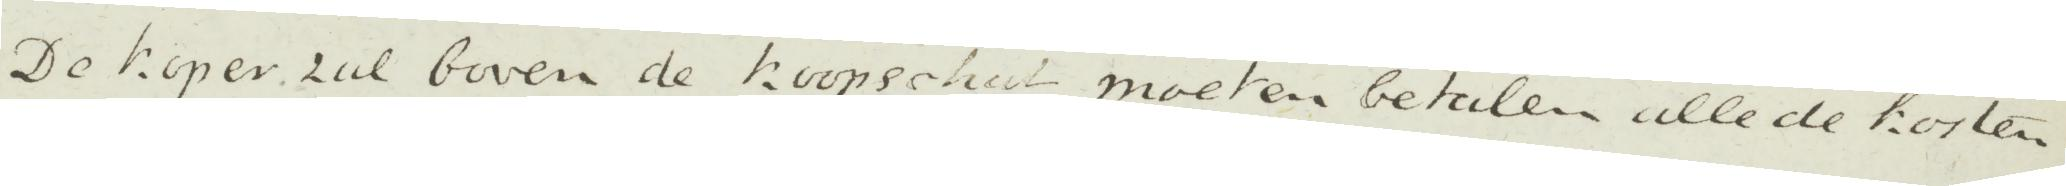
De koper zal boven de koopschat moeten betalen alle de kosten
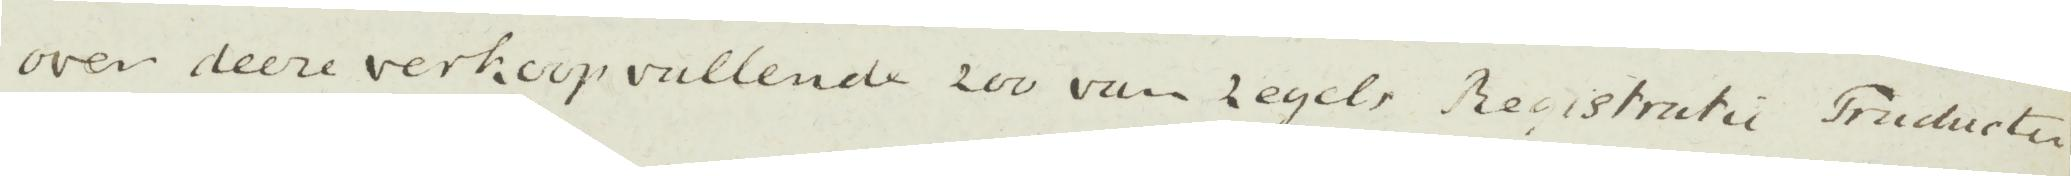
over deeze verkoop vallende zoo van zegels Registratie Traductie
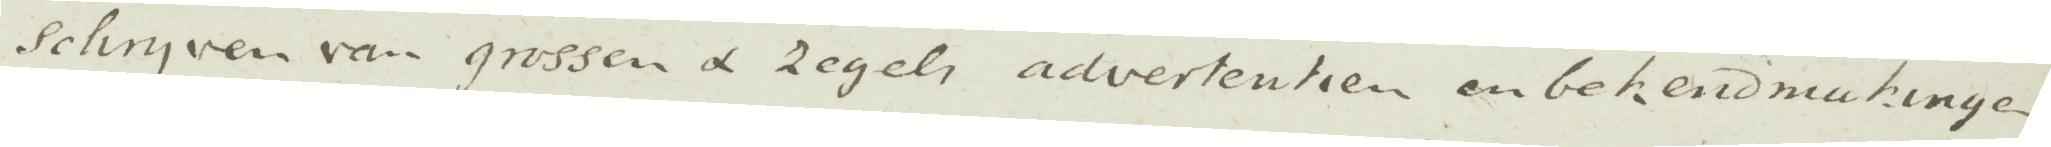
schryven van grossen & zegels advertentien en bekendmakingen
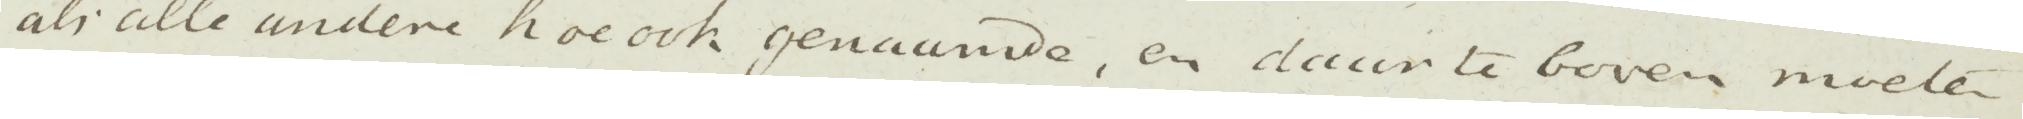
als alle andere hoe ook genaamde, en daar te boven moeten
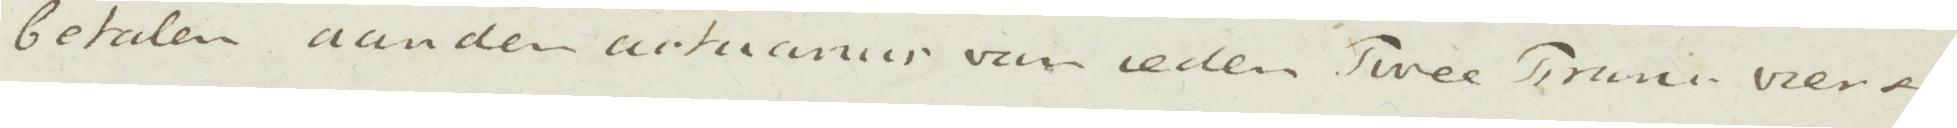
betalen aan den actuanur van ieder Twee Franc vier en
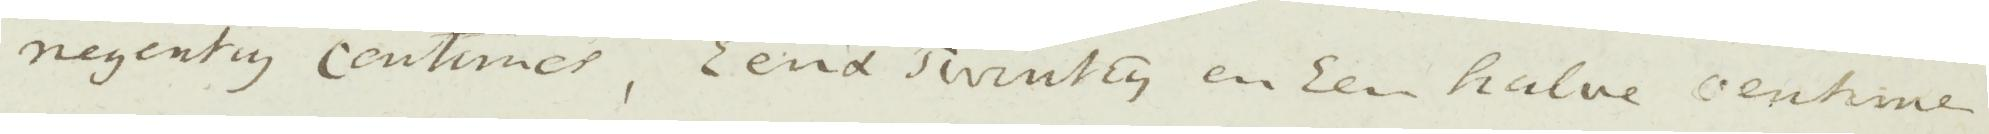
negentig centimes, Een & Twintig en Een halve centime
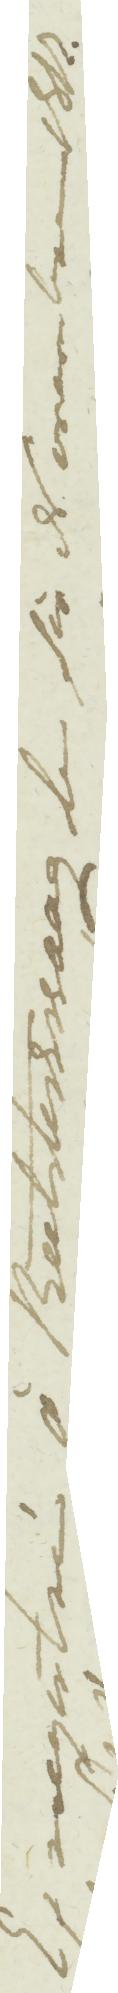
Enregistré à Beetsterzwaag le six Novembre 1812.
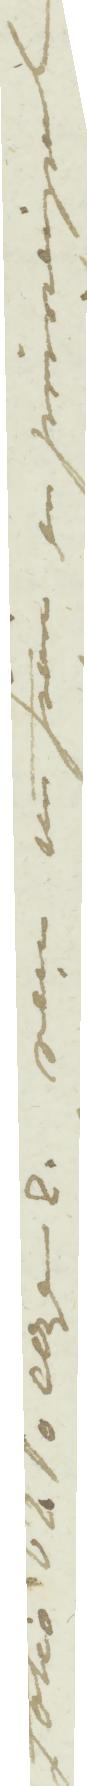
folio 64 Vo caze 2 reçu un franc en principal
